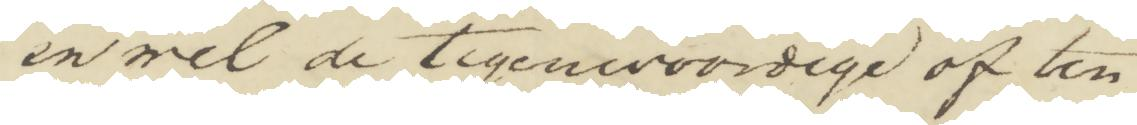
en wel de tegenwoordige of ten
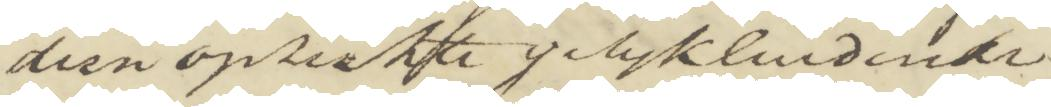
dien opzichte gelykluidende
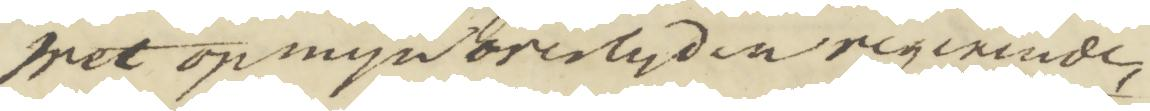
wet op myn overlyden vigerende,
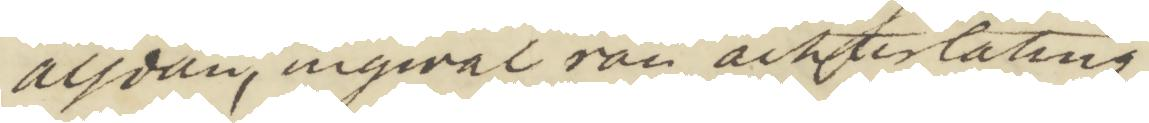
als dan, ingeval van achterlating
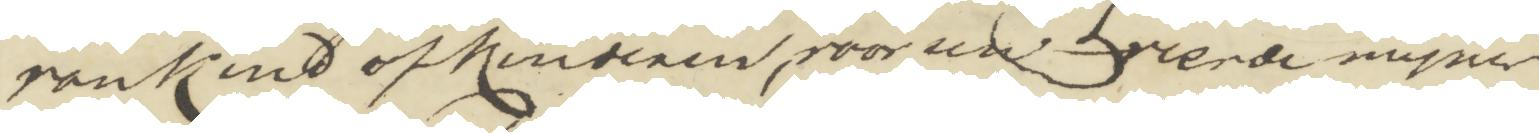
van kind of kinderen, voor ieder vierde myner
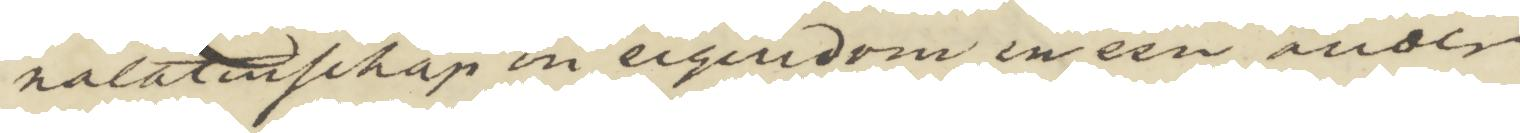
nalatenschap in eigendom en een ander
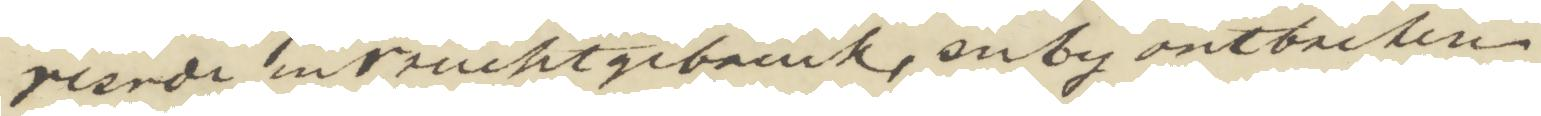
vierde in vruchtgebruik, en by ontbreken
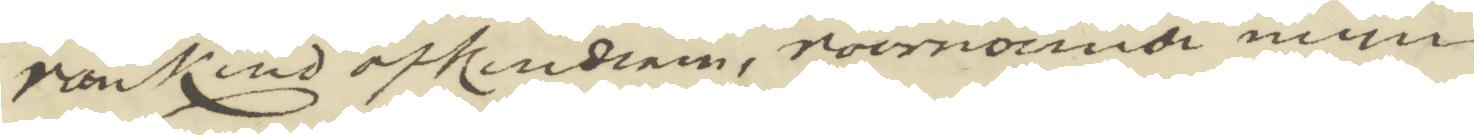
van kind of kinderen, voornoemde myn
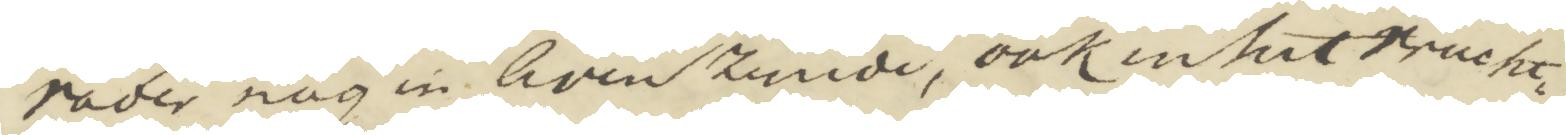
vader nog in leven zynde, ook in het vrucht:
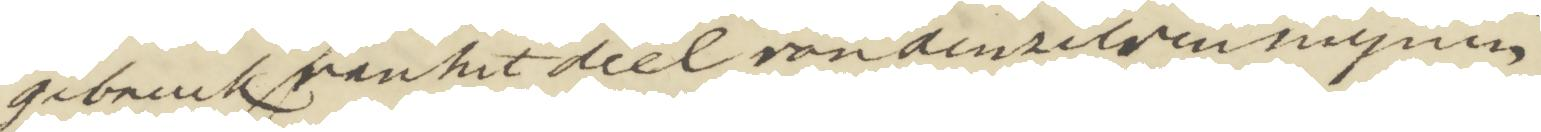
=gebruik van het deel van denzelven mynen
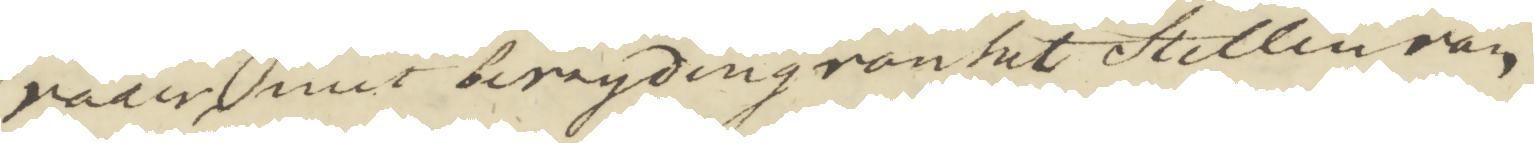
vader, met bevryding van het stellen van
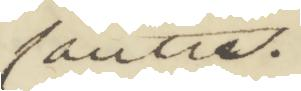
Cautie.
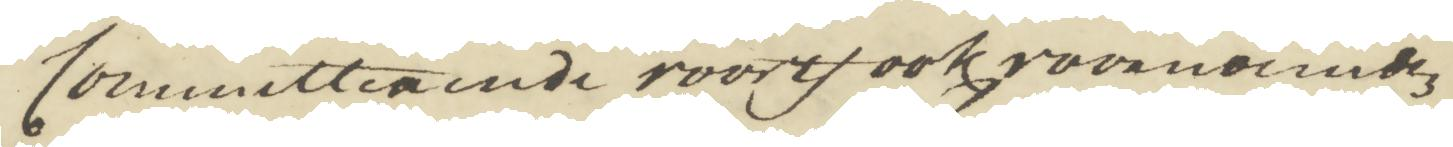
Committerende voorts ook voornoemden
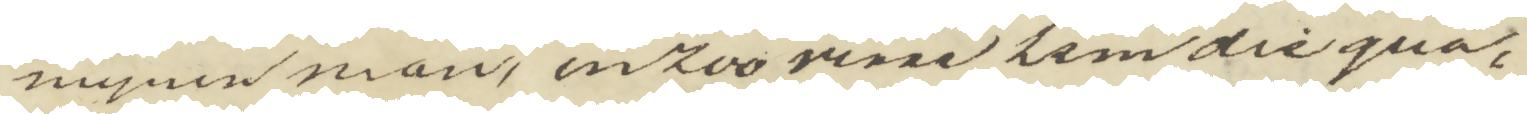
mynen man, inzoo verre hem die qua„
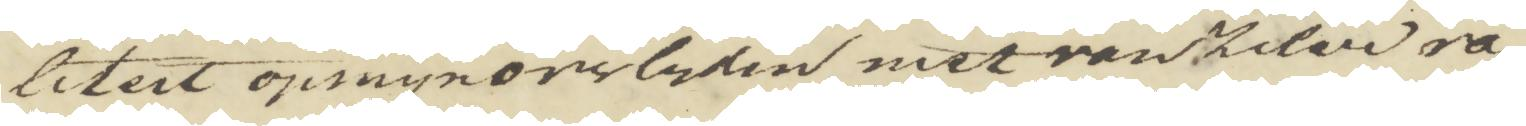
liteit op myn ovelyden niet van zelve van
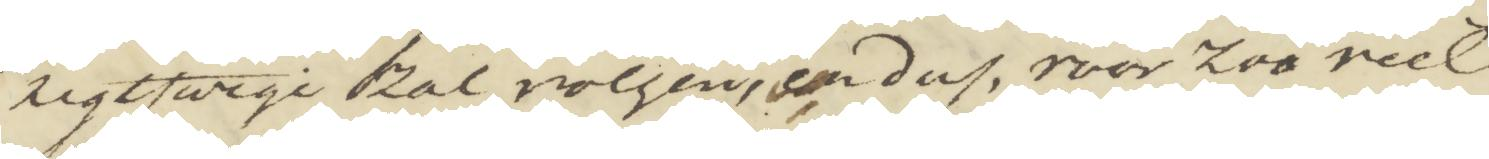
regtstwege zal volgen, en dus, voor zoo veel
